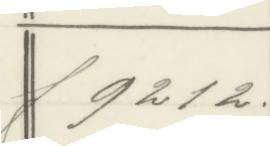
ƒ 9212
